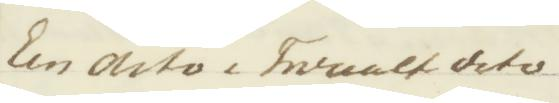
Een dito & Twaalf dito
